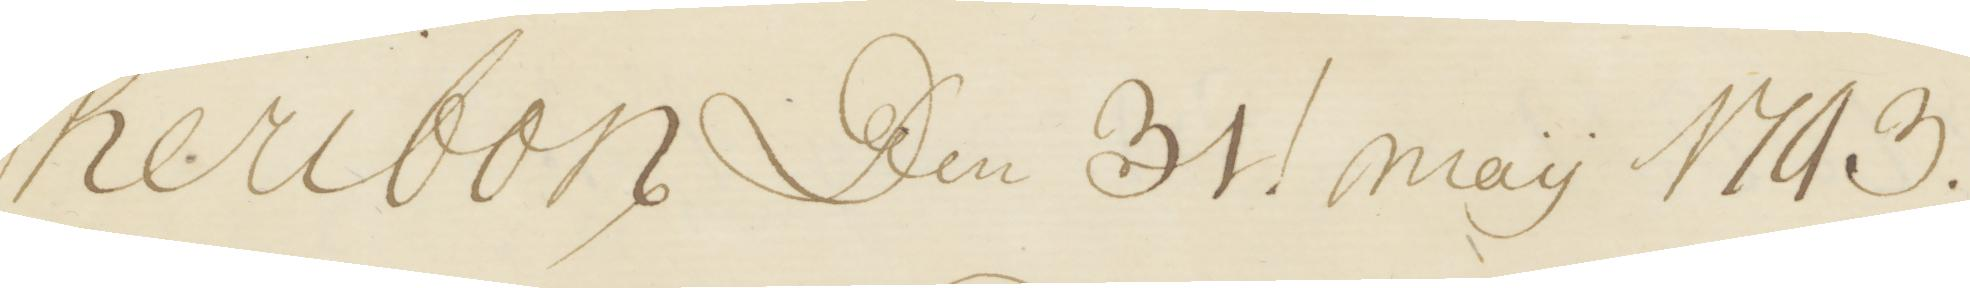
heribon Den 31./ maij 1743.
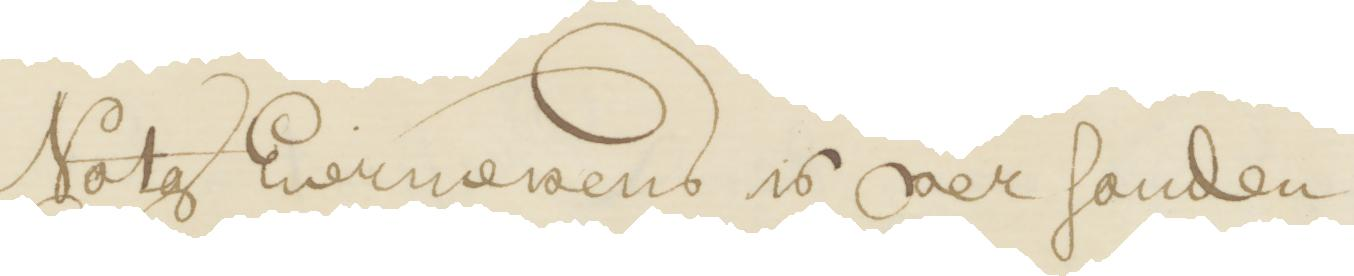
Nota hiernevens is versonden
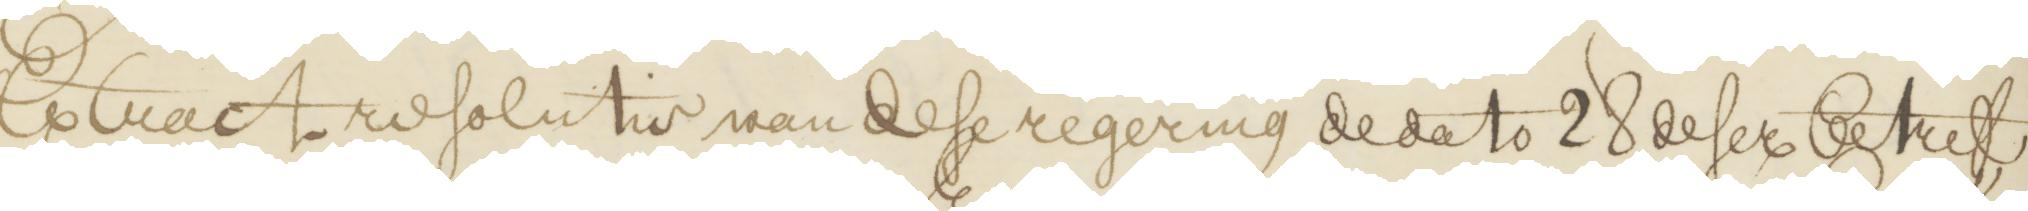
Extract resolutie van dese regering de dato 28 deser betref
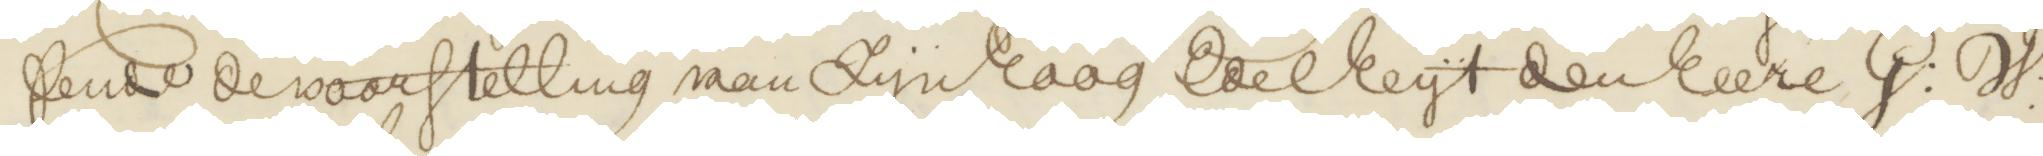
fende de voorstelling van Zijn hoog Edelheijt den heere G: W:
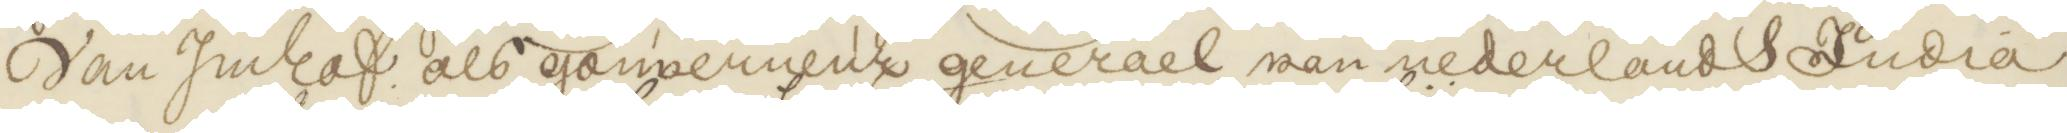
van Jmhof als gouverneur generael van nederlands India
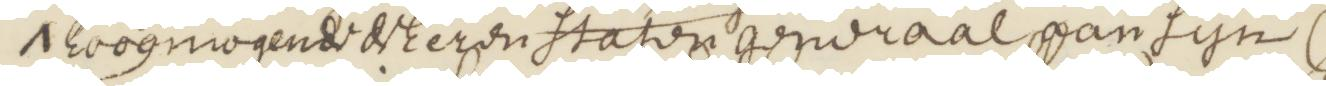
^ hoog mogende de heren Staten generaal aan Sijn
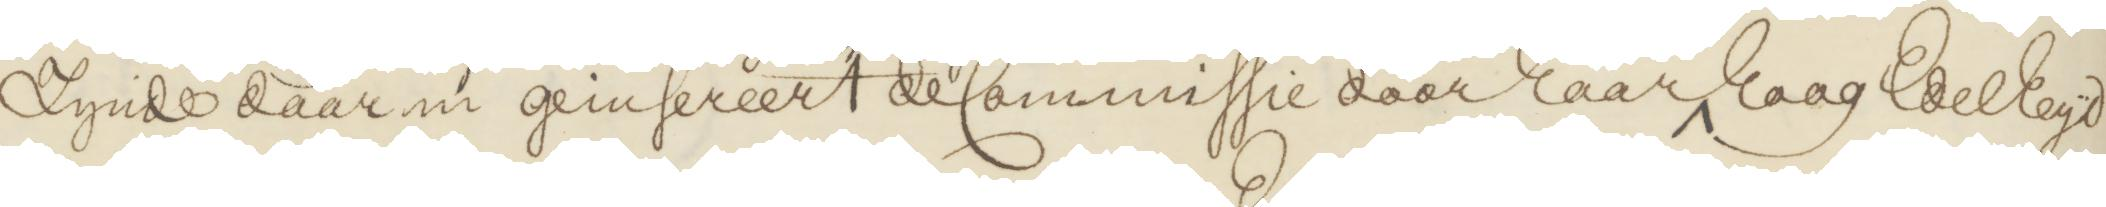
zynde daar in geinsereert de Commissie door haar ^ hoog Edelheijd
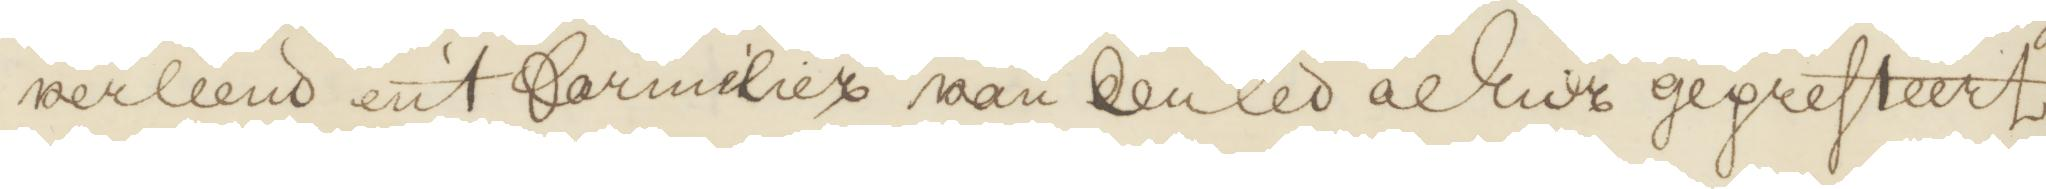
verleend en ’t formulier van den Eed alhier gepresteert
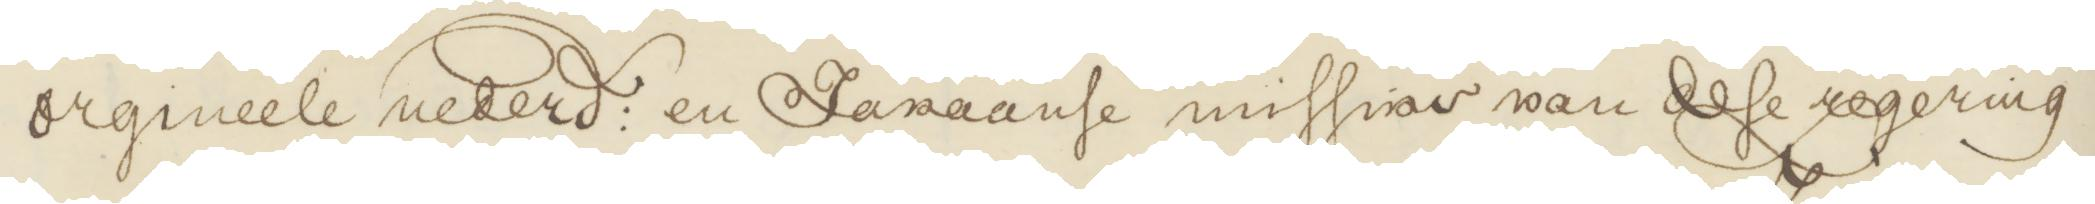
orgineele nederd: en Iavaanse missive van dese regering
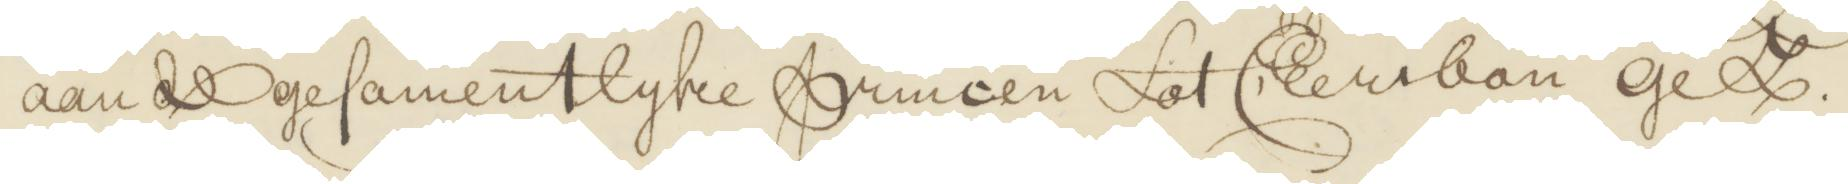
aan de gesamentlyke princen tot Cheribon geZ.
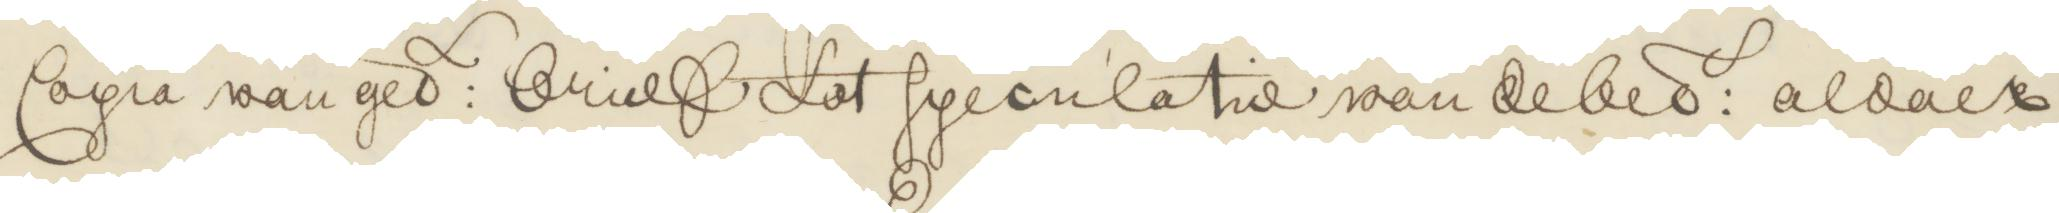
Copia van ged: brief tot speculatie van de bed:s aldaer
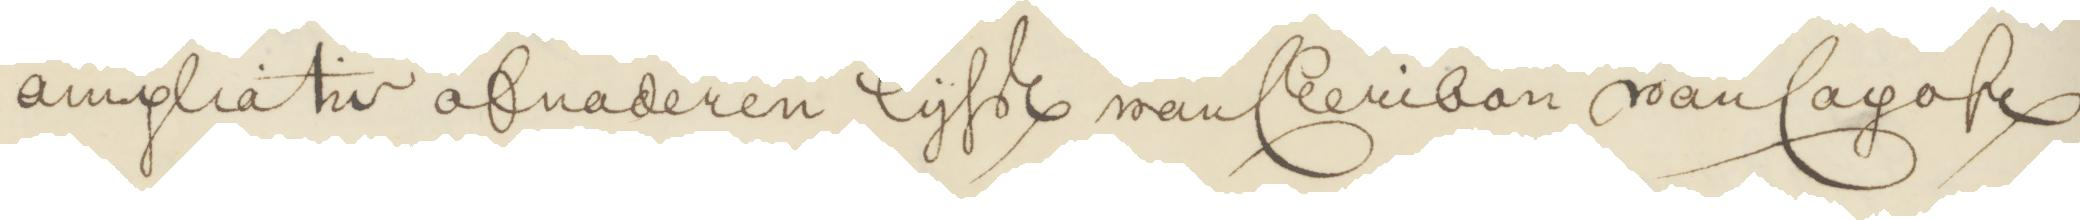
ampliatie of naderen Eijsch van Cheribon van Capok
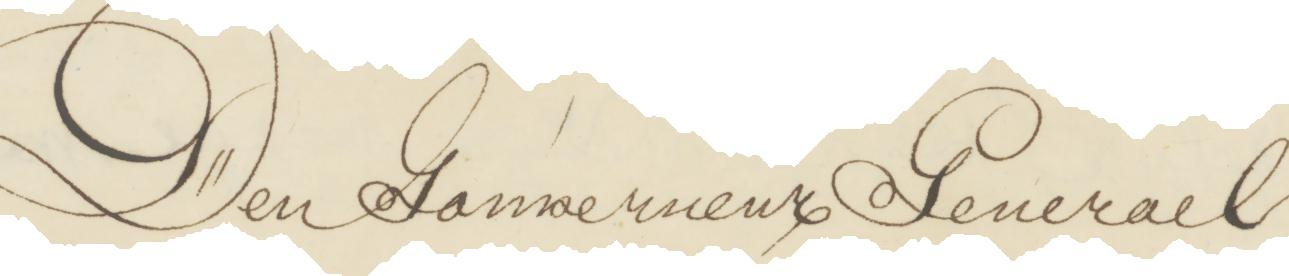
Den Gouverneur Generael
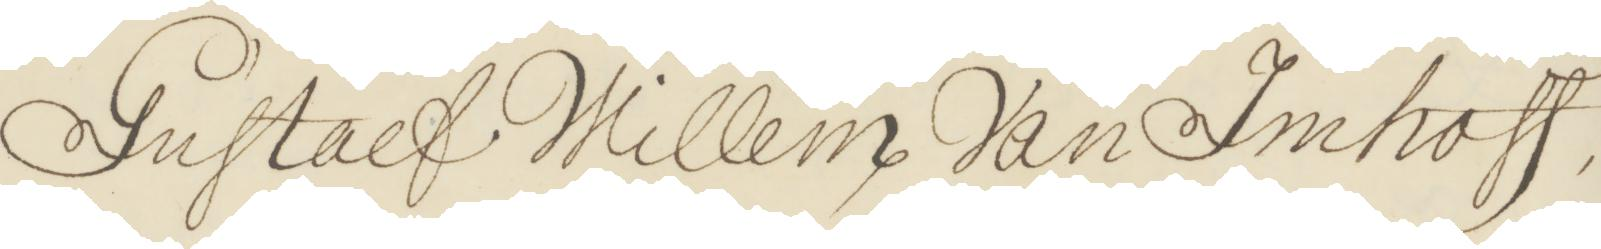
Gustaef Willem Van Imhoff,
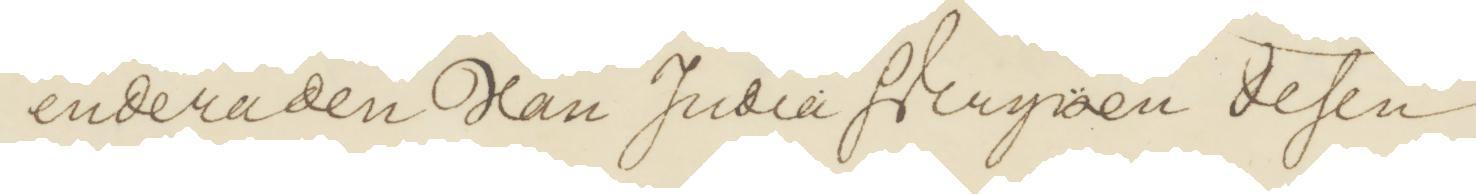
ende raden Van Jndia Schryven desen
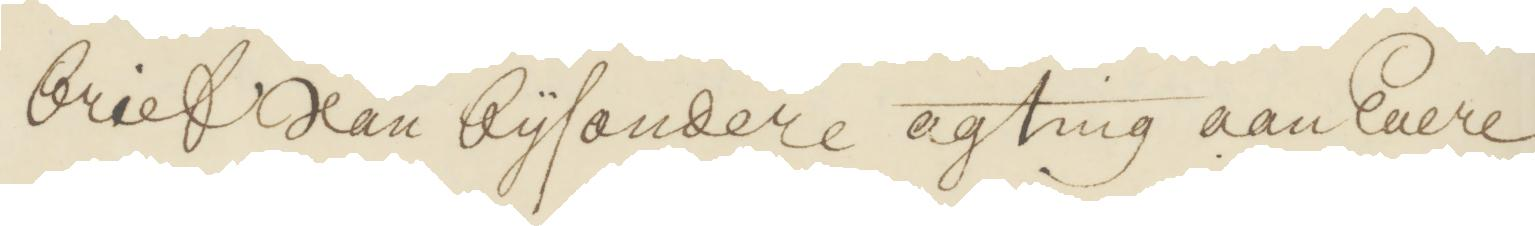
brief van bijsondere agting aan haere
